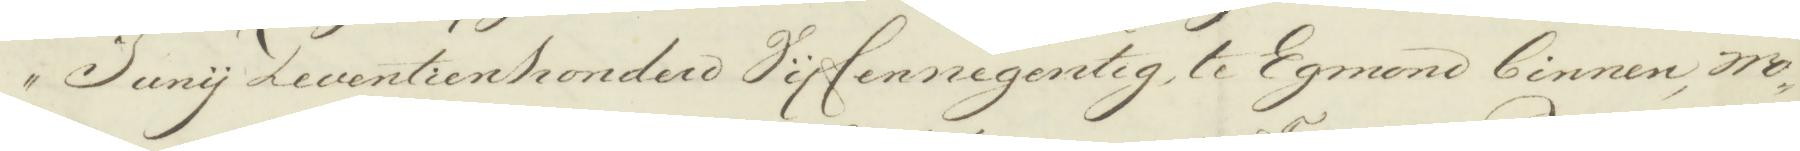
„ Iunij Zeventien honderd Vijfennegentig, te Egmond binnen, wo„
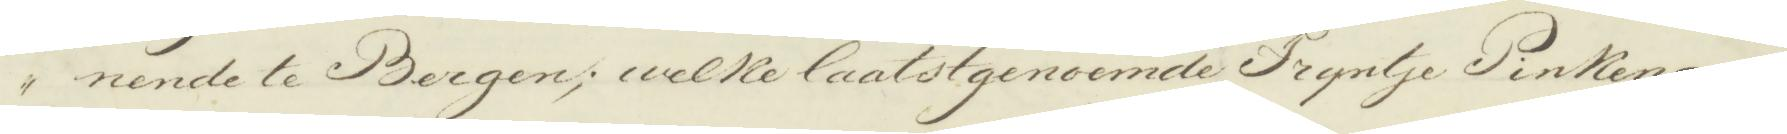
„ nende te Bergen; welke laatstgenoemde Tryntje Pinkenaar
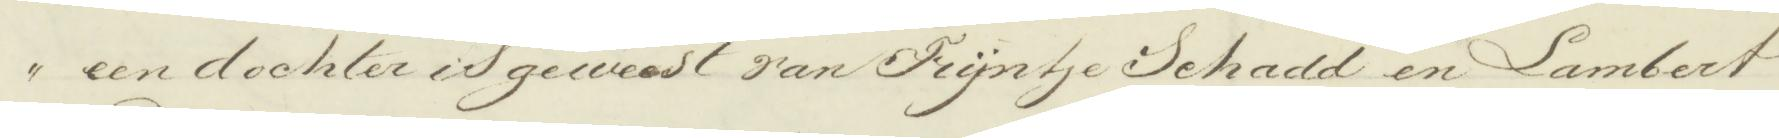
„ een dochter is geweest van Trijntje Schadd en Lambert
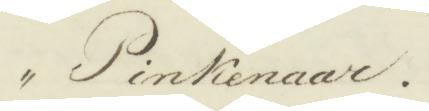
„ Pinkenaar .
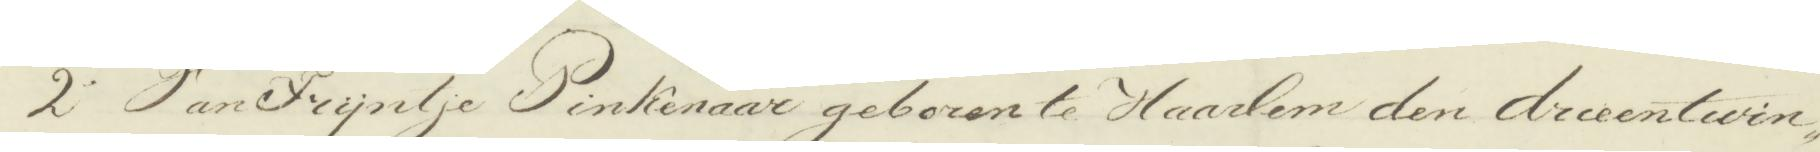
2e Van Trijntje Pinkenaar geboren te Haarlem den drieentwin
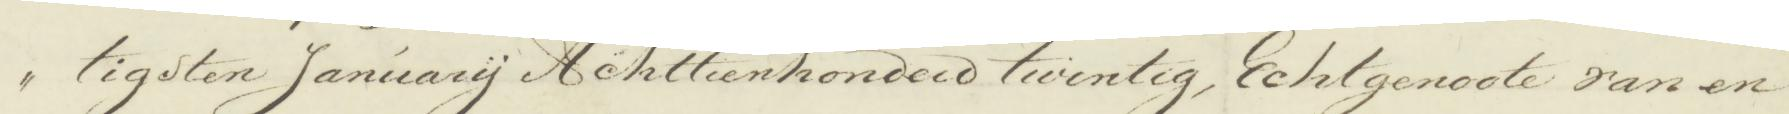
„ tigsten Januarij Achttienhonderd twintig, Echtgenoote van en
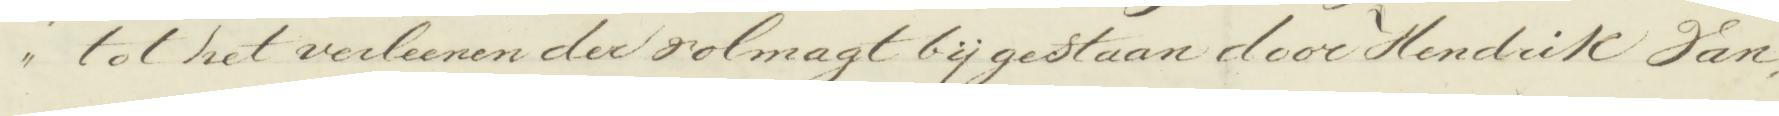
„ tot het verleenen der volmagt bijgestaan door Hendrik Van
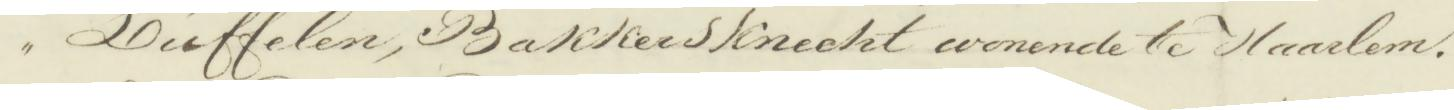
„ Duffelen, Bakkersknecht wonende te Haarlem.
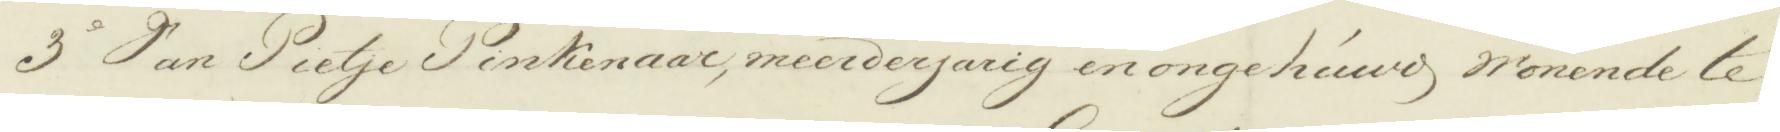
3e Van Pietje Pinkenaar, meerderjarig en ongehuwd wonende te
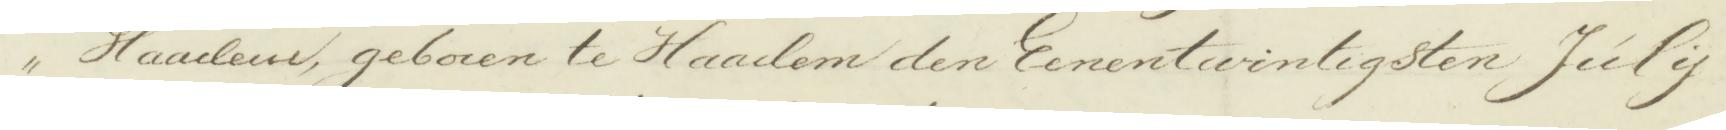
„ Haarlem, geboren te Haarlem den Eenentwintigsten Julij
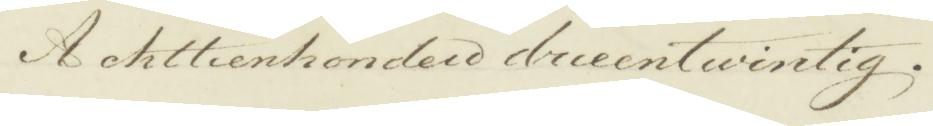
Achttienhonderd drieentwintig.
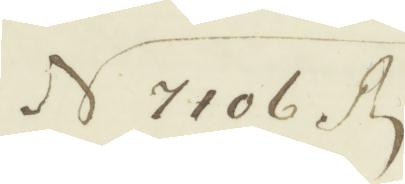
N 7106 R
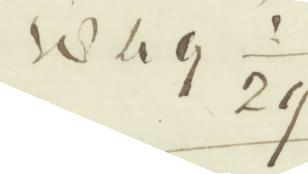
1849 1/29
